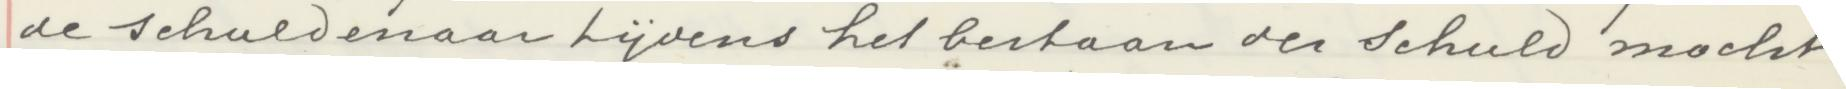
de schuldenaar tijdens het bestaan der schuld mocht
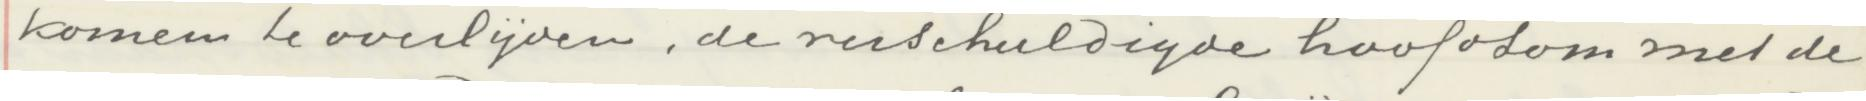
komen te overlijden, de verschuldigde hoofdzom met de
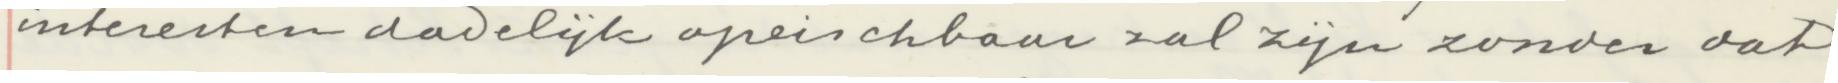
interesten dadelijk opeischbaar zal zijn zonder dat
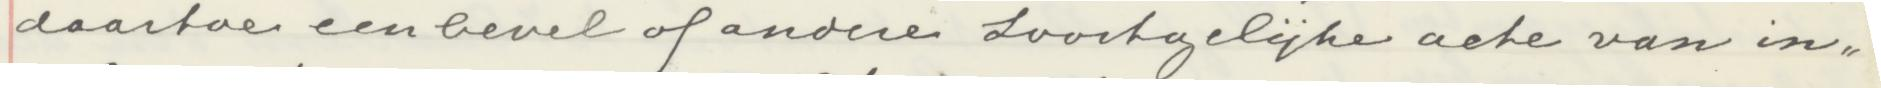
daartoe een bevel of andere soortgelijke acte van in„
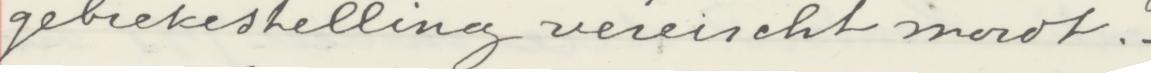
gebrekestelling vereischt wordt.
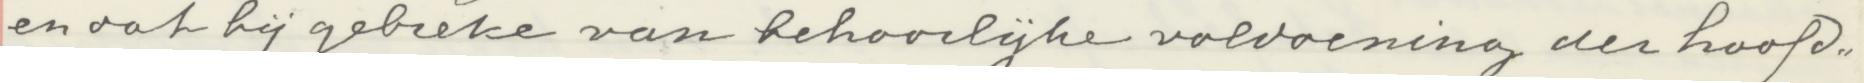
en dat bij gebreke van behoorlijke voldoening den hoofd„
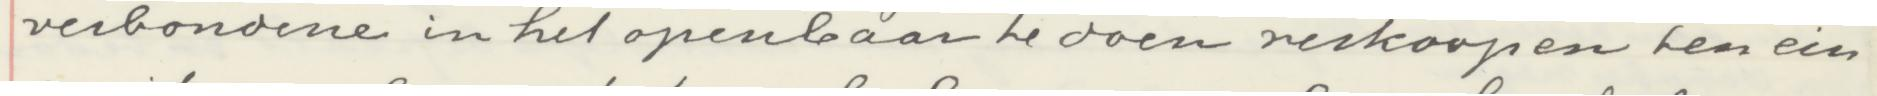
verbondene in het openbaar te doen verkoopen ten ein
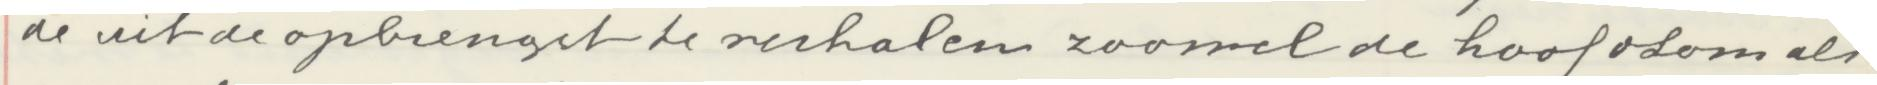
de uit de opbrengst te verhalen zoowel de hoofdzom als
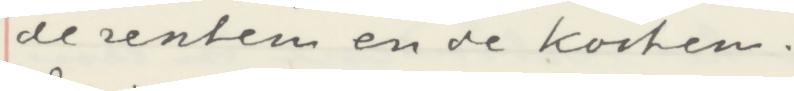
de renten en de kosten.
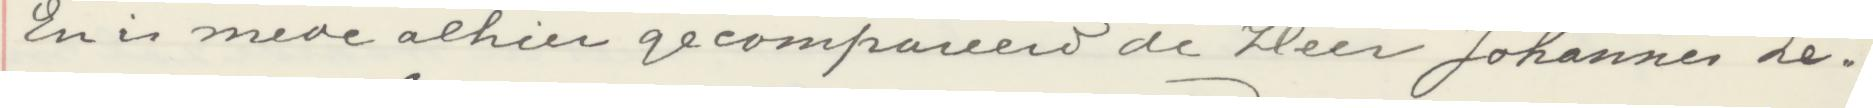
En is mede alhier gecompareerd de Heer Johannes Ge„
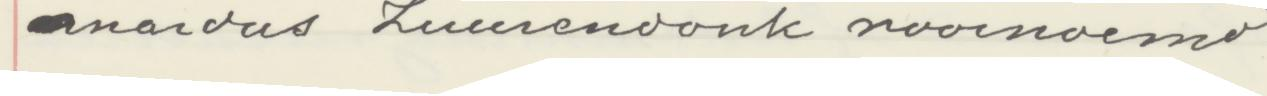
arardus Zuurendonk voornoemd
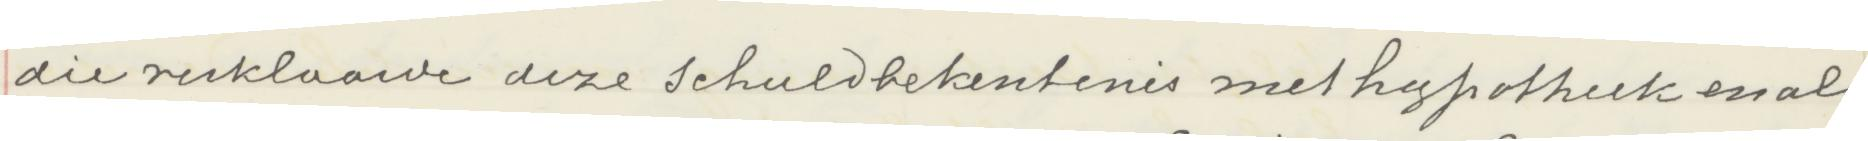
die verklaarde deze schuldbekentenis met hypotheek en al
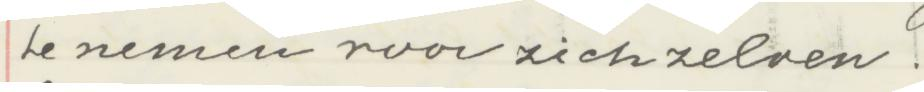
te nemen voor zich zelven.
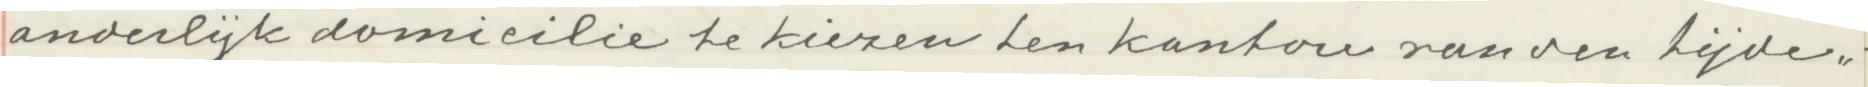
anderlijk domicilie te kiezen ten kantore van den tijde„
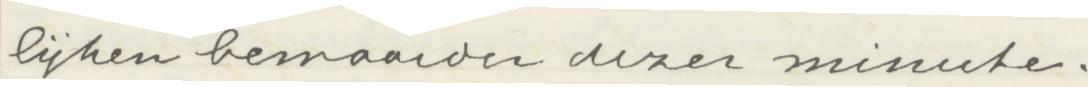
lijken bewaarden dezer minute.
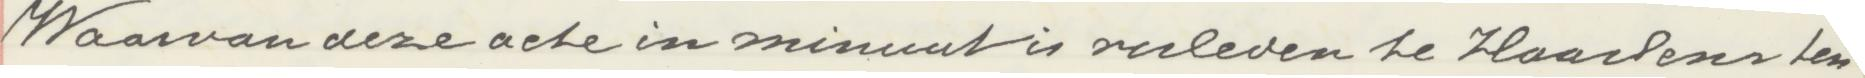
Waarvan deze acte in minuut is verleden te Haarlens ten
